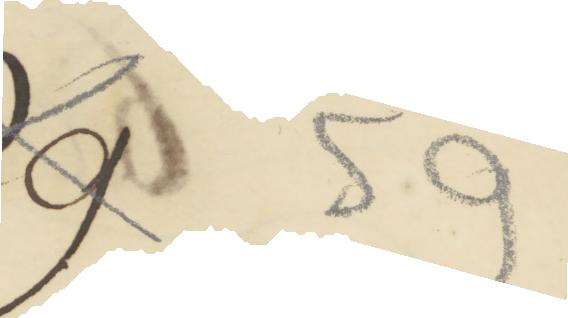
9 59
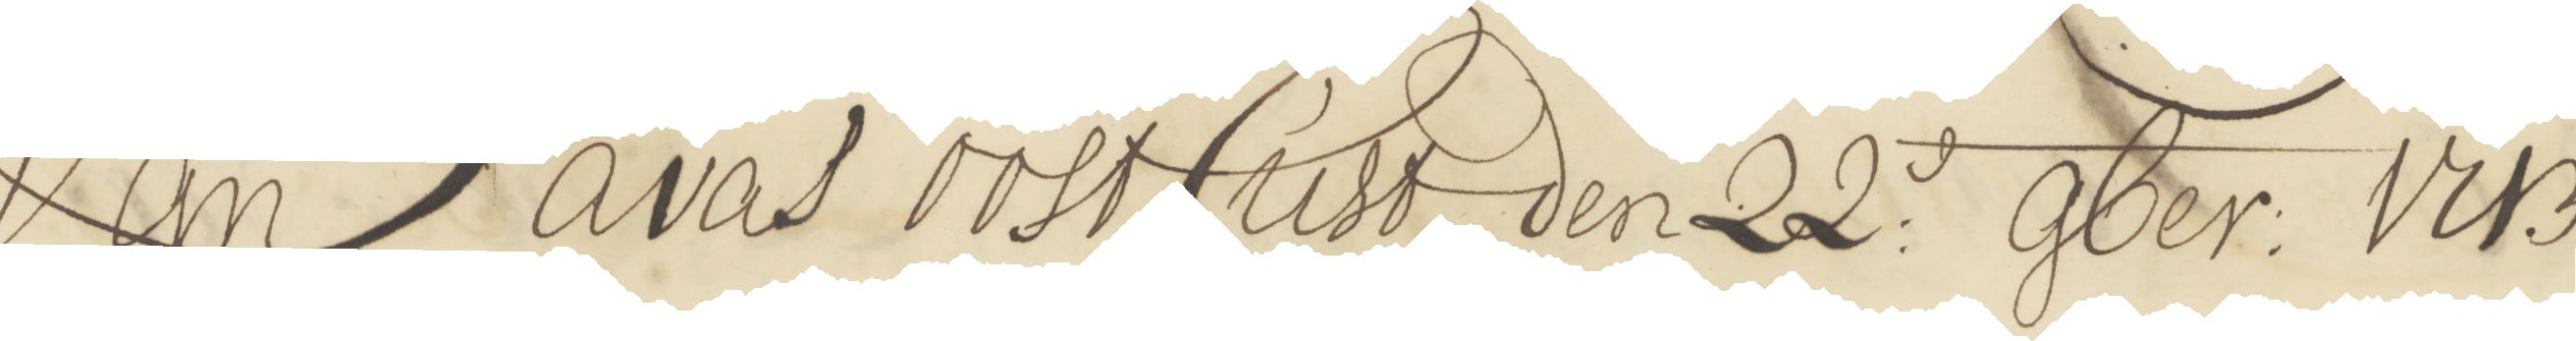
Van Javas oost Cust den 22:' 9ber: 1713
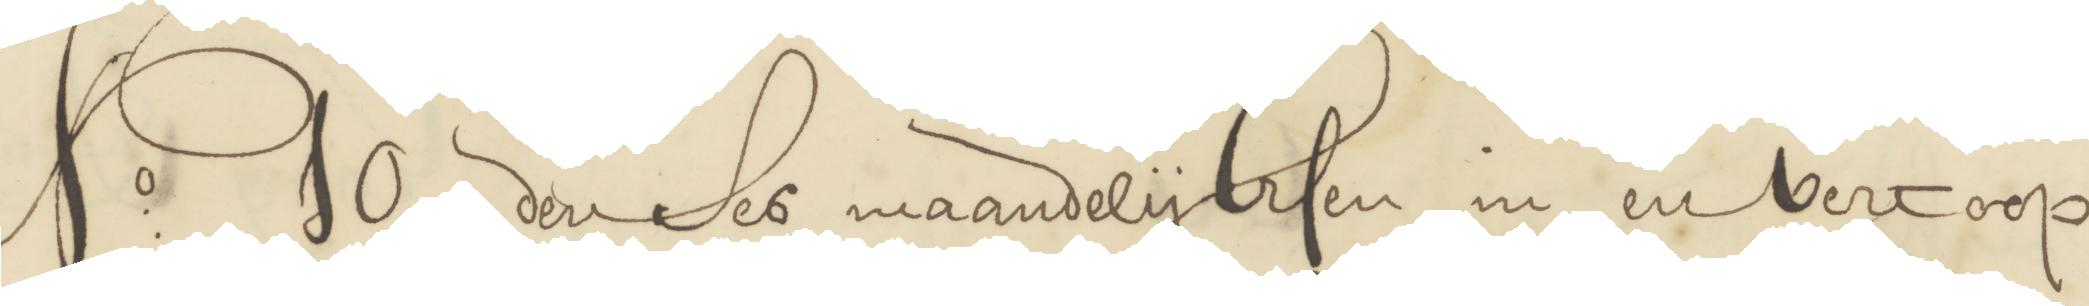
:o 10. den ses maandelijksen in en vercoop
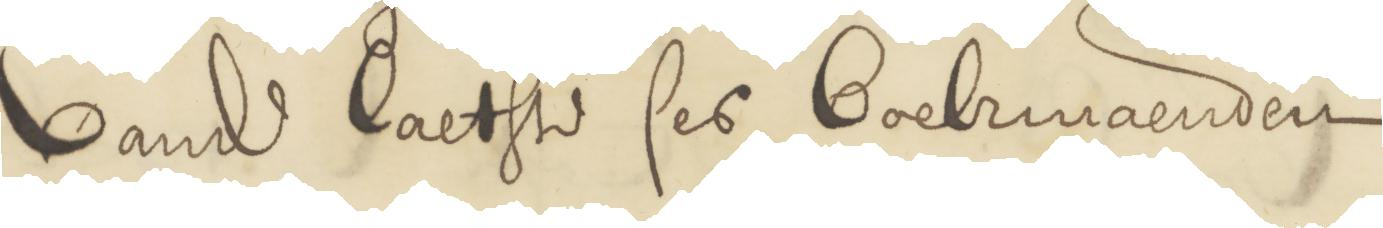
vande laetste ses boekmaenden
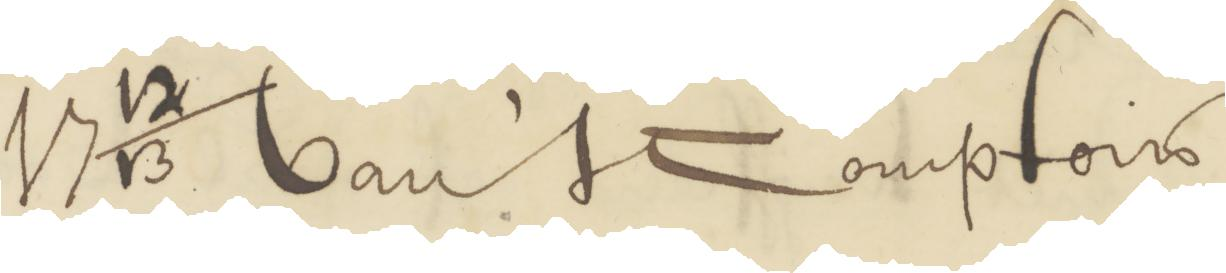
17 12/13 van ’t comptoir
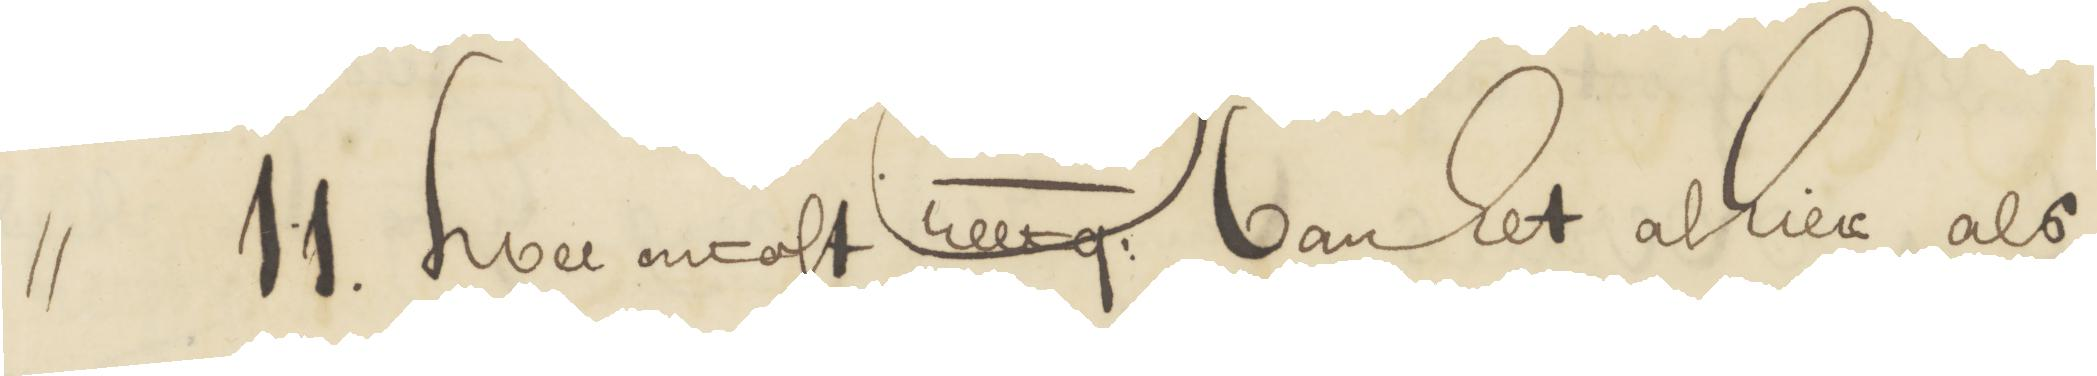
„ 11. twee oncost reecq: van het alhier als
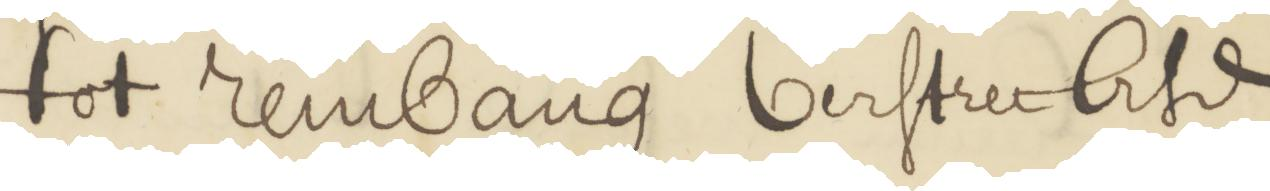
tot rembang verstreckte
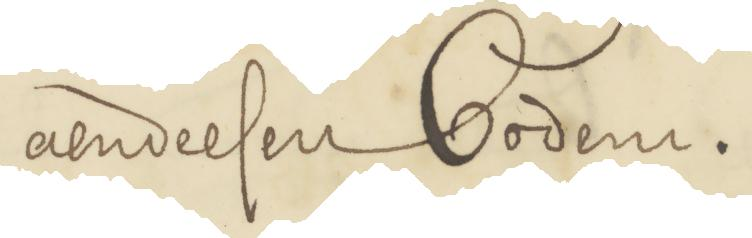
aendeesen bodem.
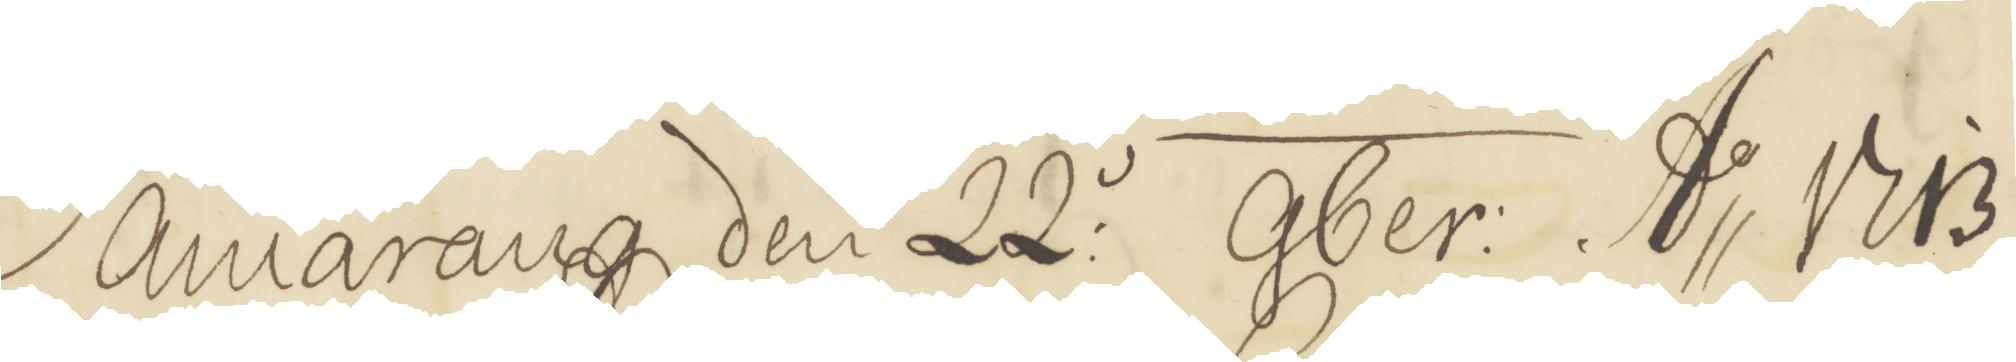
Samarang den 22:' 9ber: A„o 1713
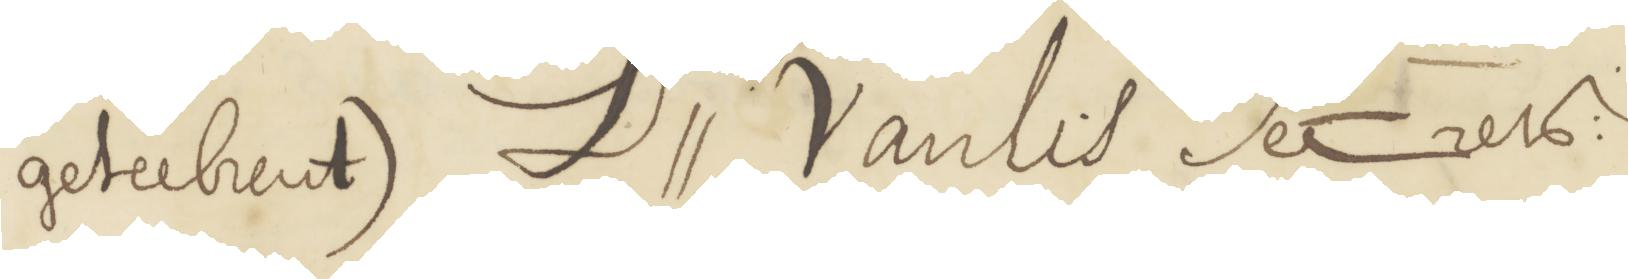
geteekent) D„e Vanlis secrets:
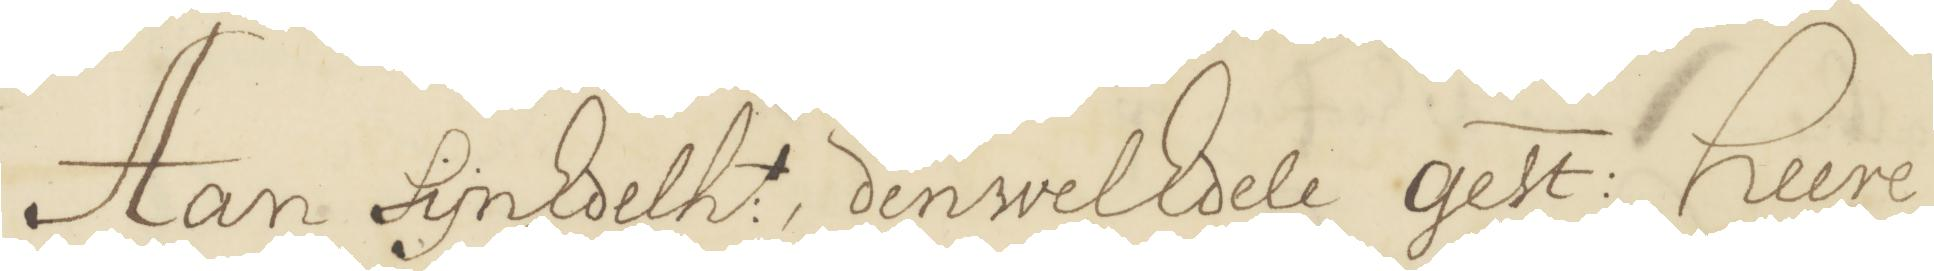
Aan sijn Edelh:t, den wel Edele gest: heere
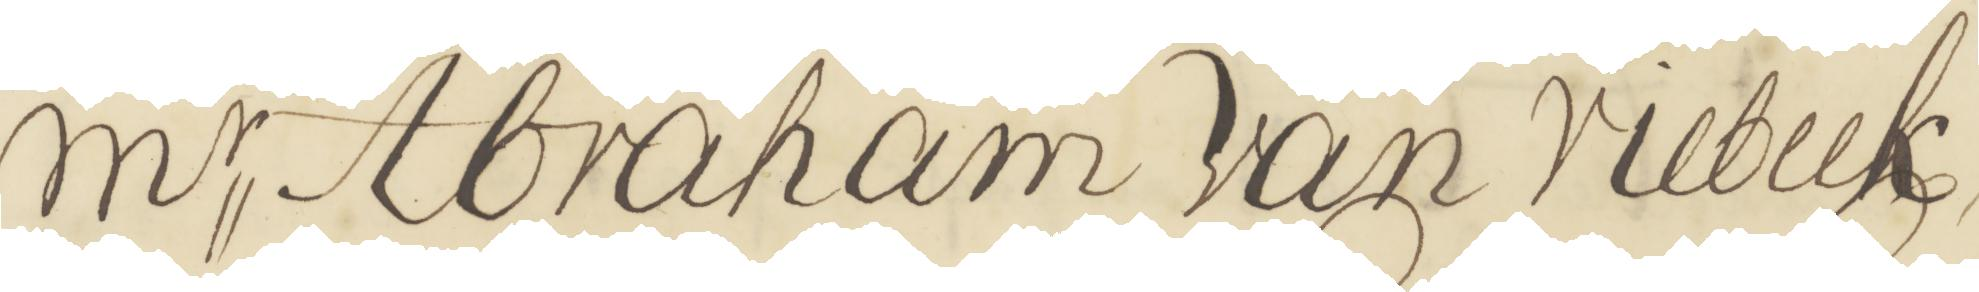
M„r Abraham van riebeek,
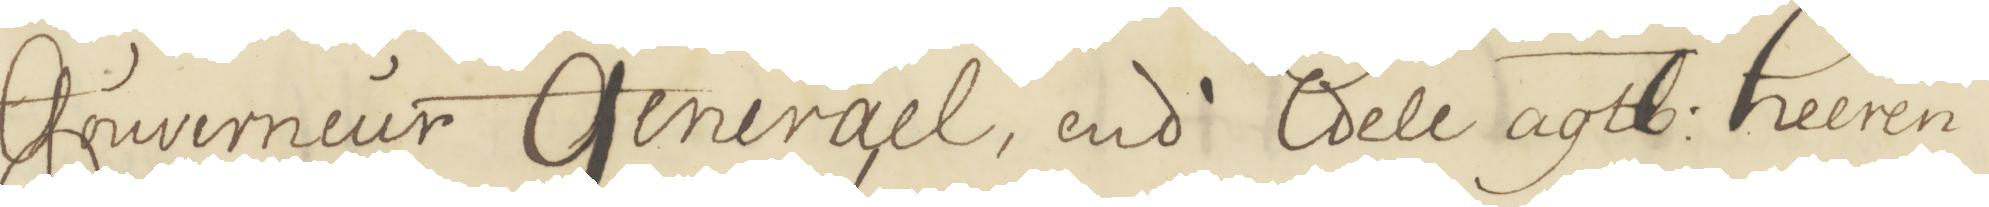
Gouverneur Generael, en d’Edele agtb: heeren
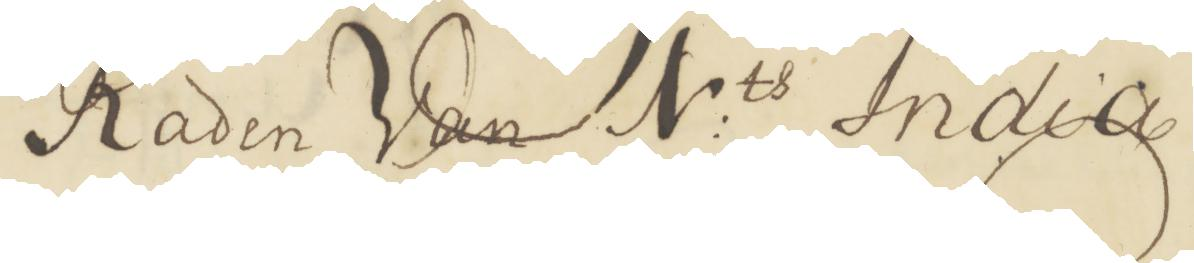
Raden Van N:ts Jndia
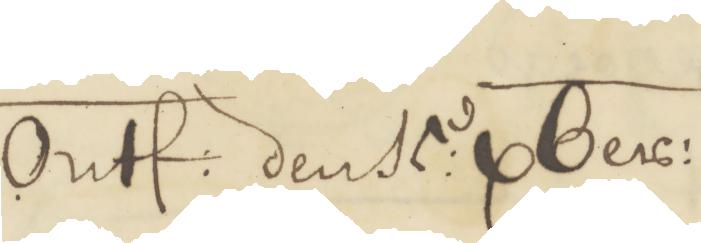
Ontf: den 15:e xber:
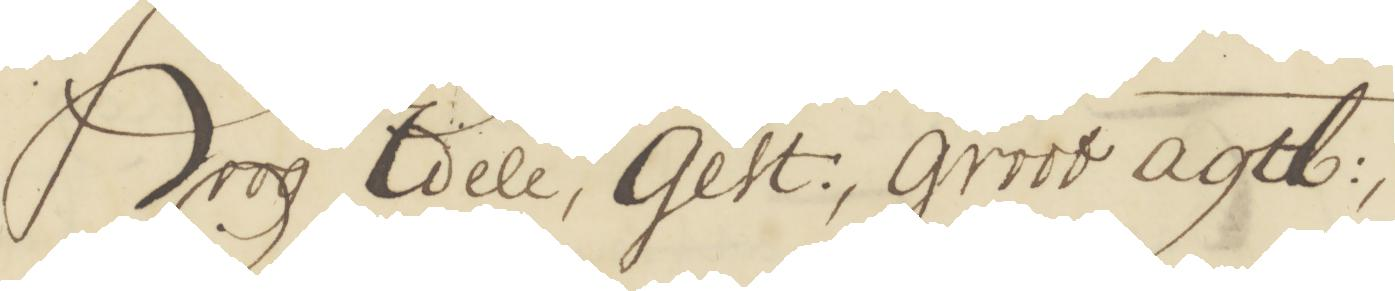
Hoog Edele, gest:, groot agtb:,
